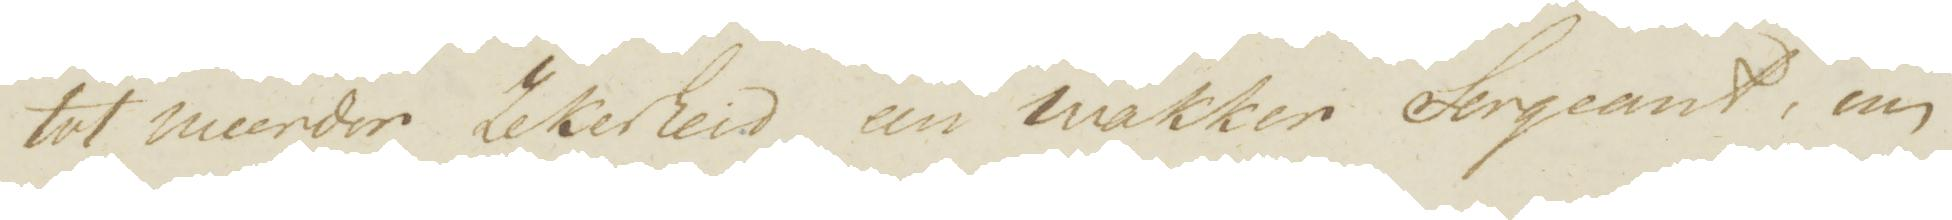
tot meerder zekerheid een wakker Sergeant, in
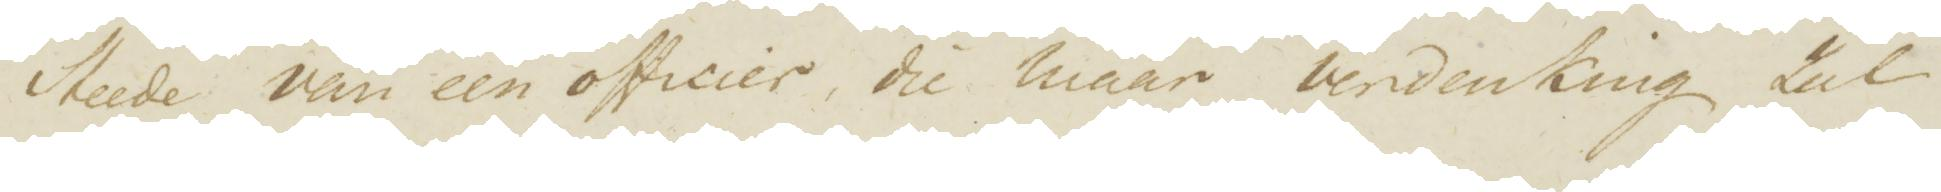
steede van een officier, die maar verdenking zul
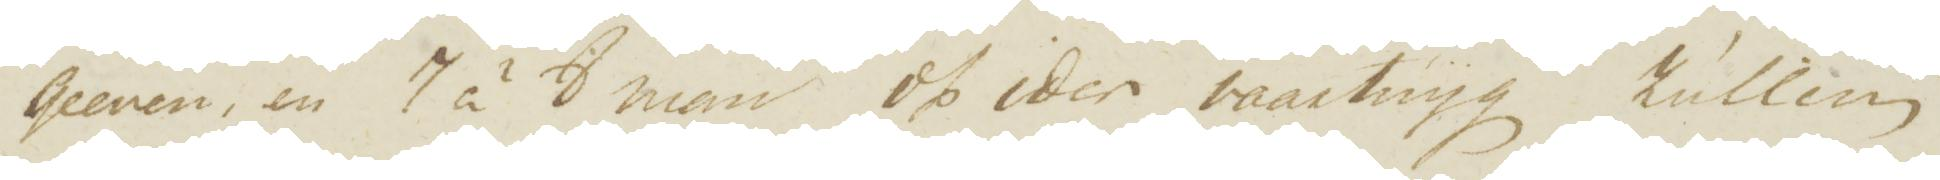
geeven, en 7 â 8 man op ider vaartuijg zullen
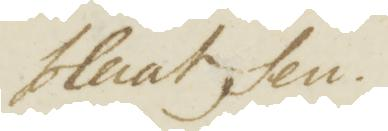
plaatsen.
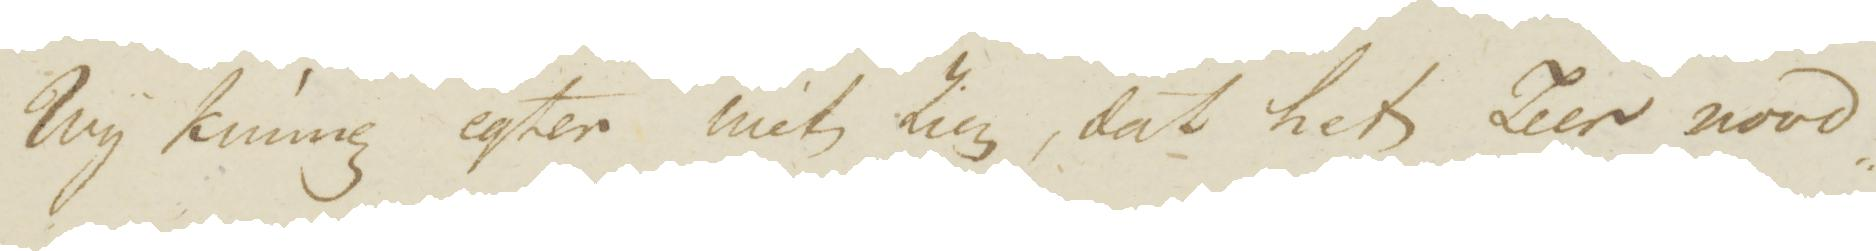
Wij kunnen egter niet zien, dat het zeer nood„
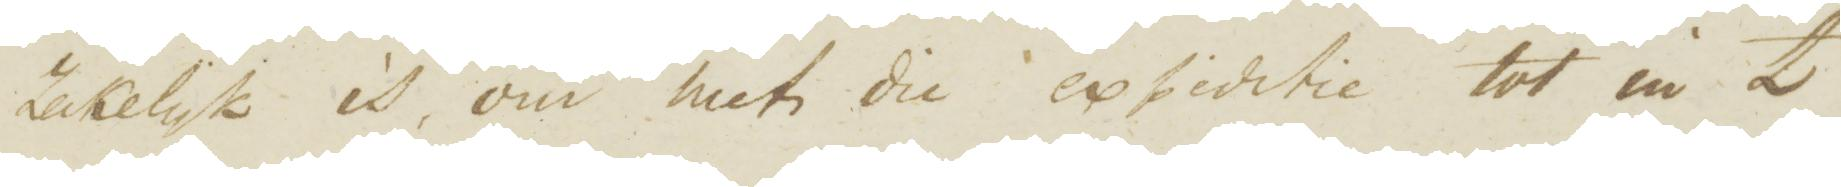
zakelijk is, om met die expeditie tot in 't
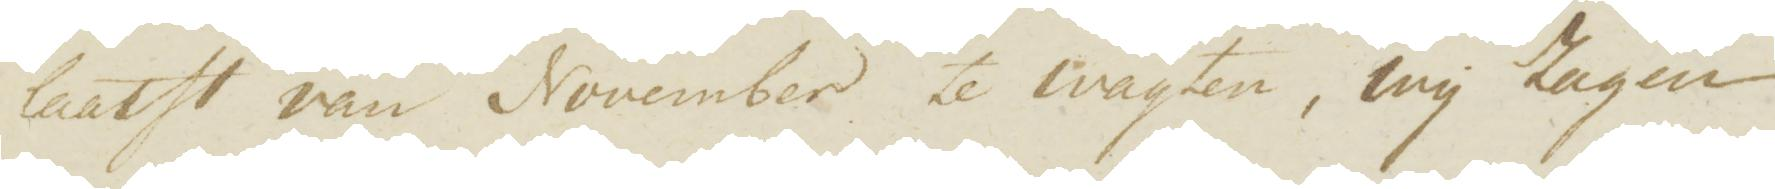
laatst van November te wagten, wij zagen
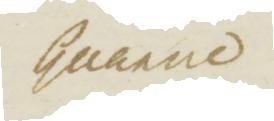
gaarne
